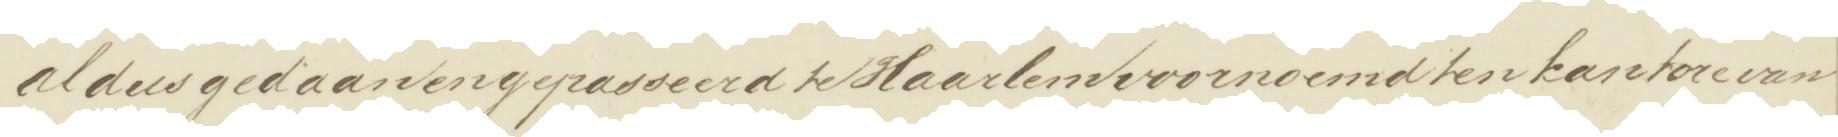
aldus gedaan en gepasseerd te Haarlem voornoemd ten kantore van
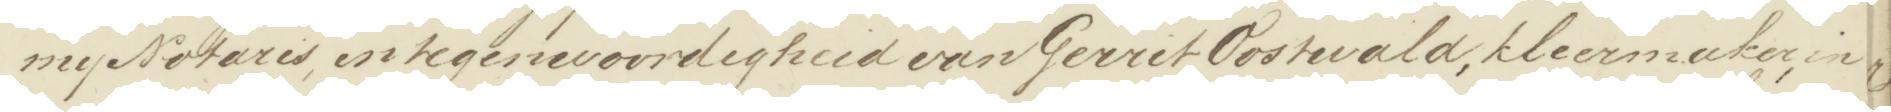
my Notaris, in tegenwoordigheid van Gerrit Oostwald, kleermaker, in
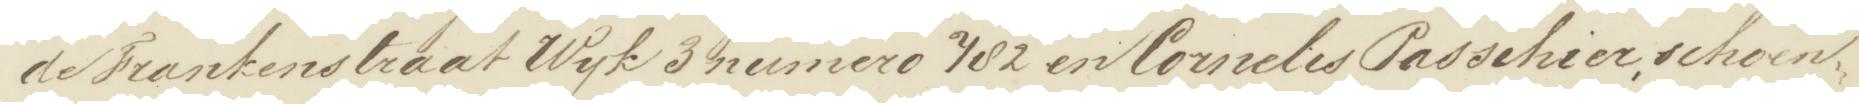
de Frankenstraat Wyk 3 numero 782 en Cornelis Passchier, schoen„
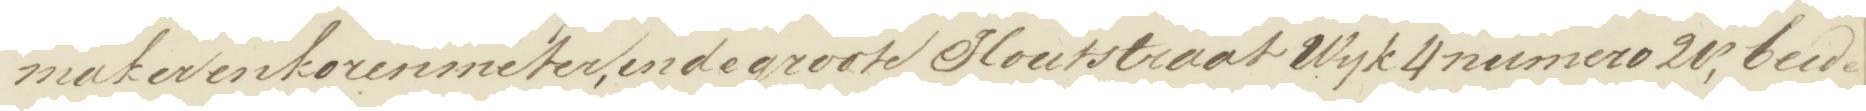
maker en korenmeter, in de groote Houtstraat Wyk 4 numero 28 beide
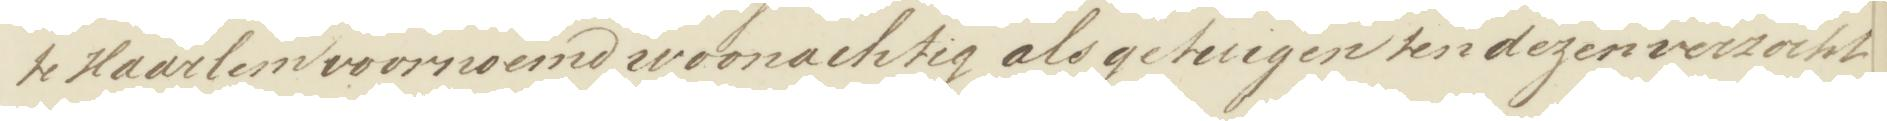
te Haarlem voornoemd woonachtig als getuigen ten dezen verzocht
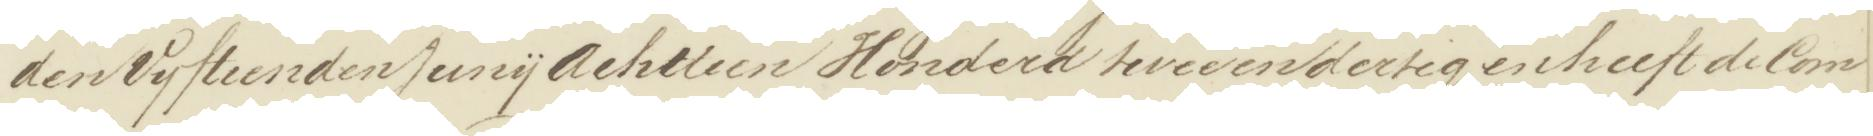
den Vyftienden Junij Achttien Honderd twee en dertig en heeft de Com
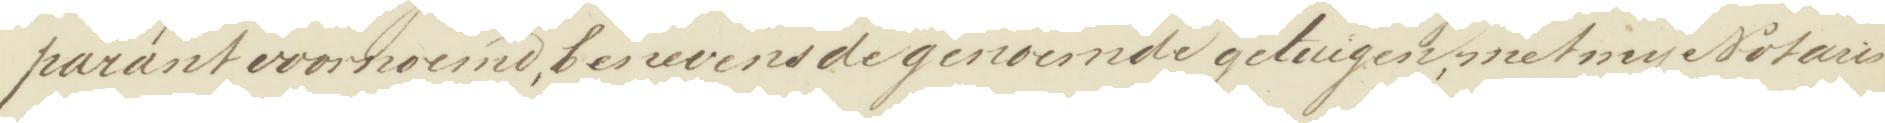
parant voornoemd, benevens de genoemde getuigen, met my Notaris
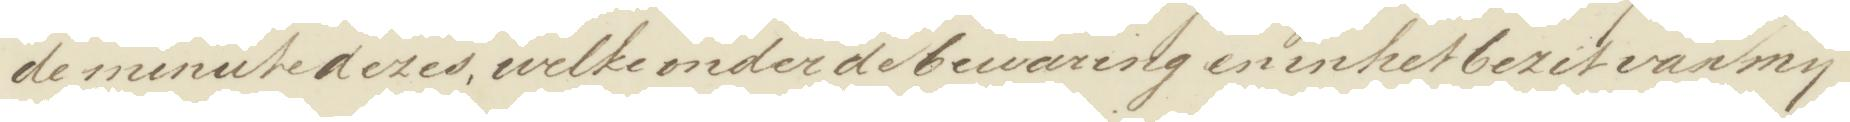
de minute dezes, welke onder de bewaring en in het bezit van my
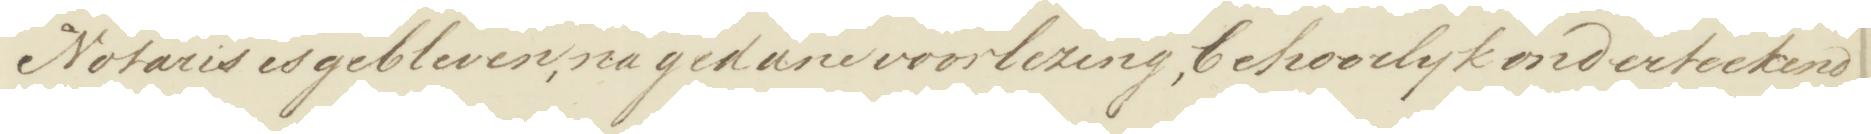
Notaris is gebleven, na gedane voorlezing, behoorlyk onderteekend
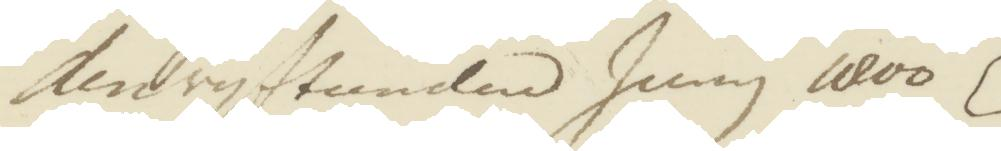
den vyftienden Juny 1800
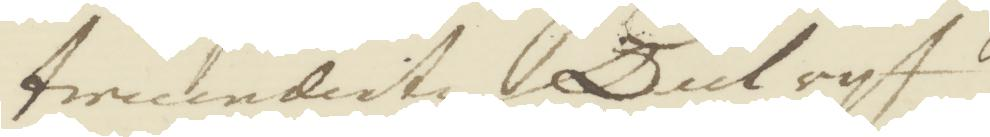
twee in dertig Deel vyf
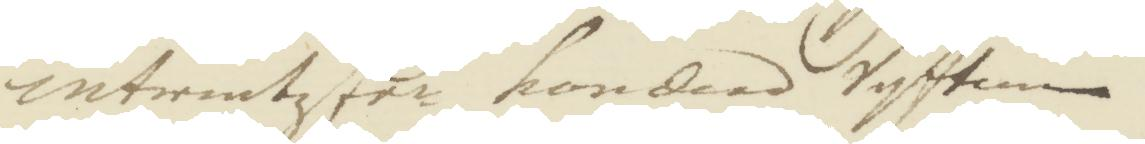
en twintig fak honderd Vyftien
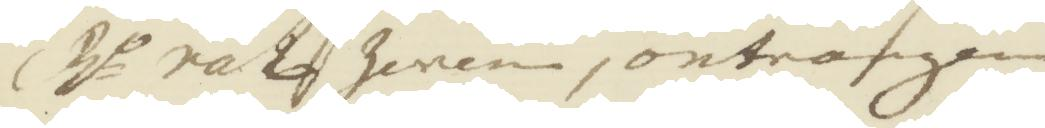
R=o vak zeven, ontvangen
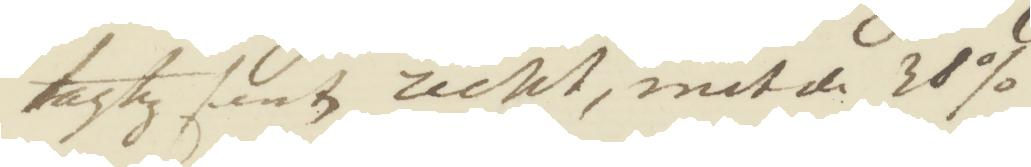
tagtig Cent recht, met de 38%
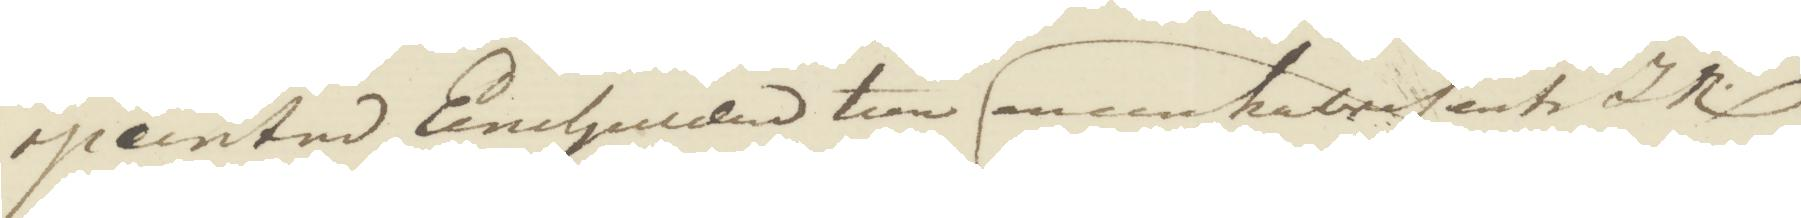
opcenten Eene Gulden tien en een halve cent ZR
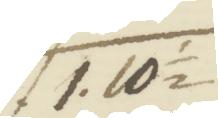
ƒ„1.10½:
